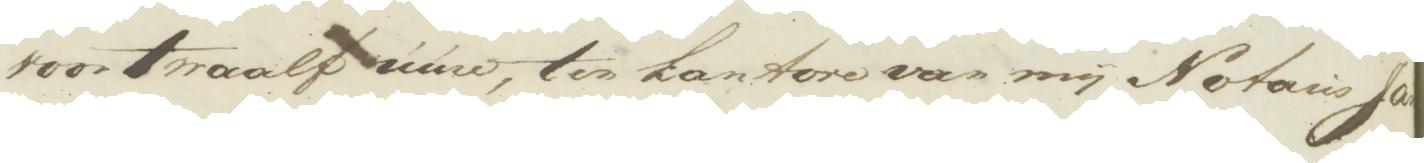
voor twaalf uure, ten kantore van mij Notaris Ja
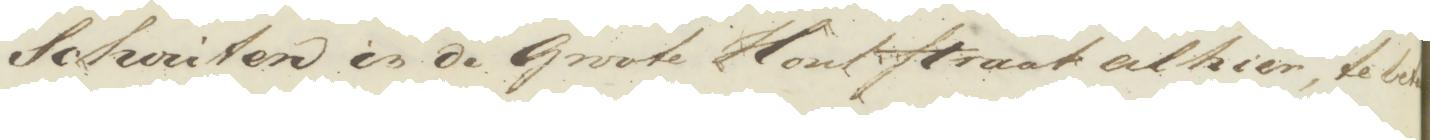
Schouten in de Groote Houtstraat alhier, te be
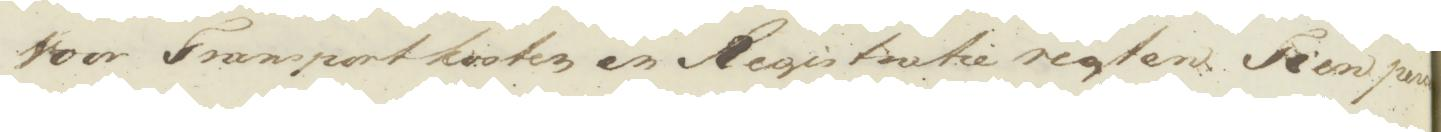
voor Transportkosten en Registratie regten Tien per
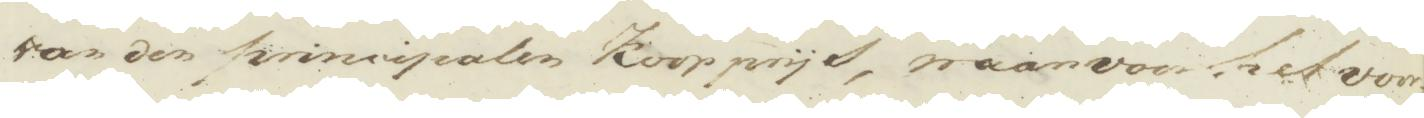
van den principalen koopprijs, waarvoor het voor
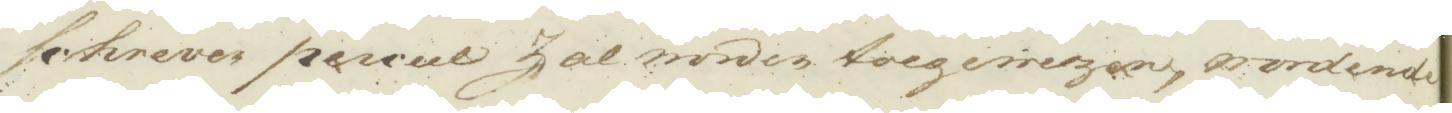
schreven perceel zal worden toegewezen, wordende
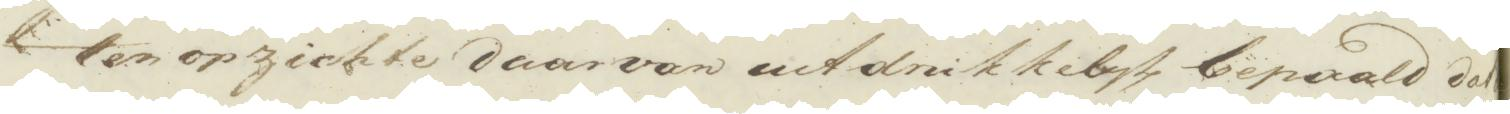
ten opzichte daarvan uitdrukkelyk bepaald dat
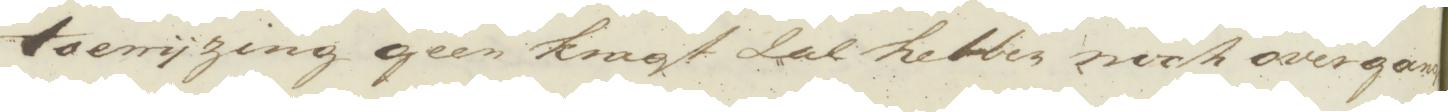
toewijzing geen kragt zal hebben noch overgan
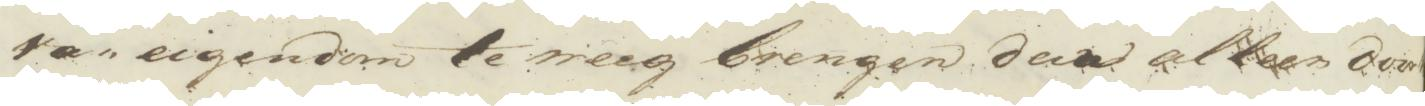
van eigendom te weeg brengen, daar alleen door
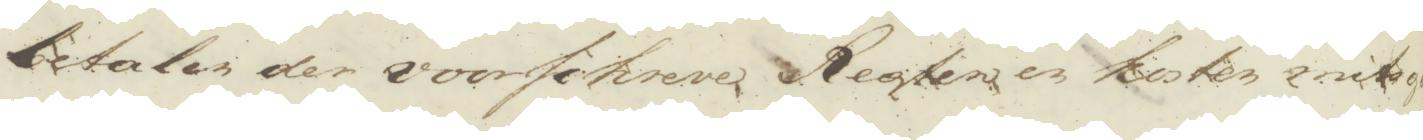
betalen der voorschreve Regten en kosten mitsg
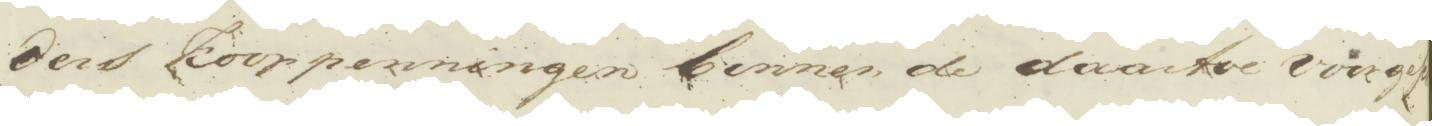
ders kooppenningen binnen de daartoe voorge
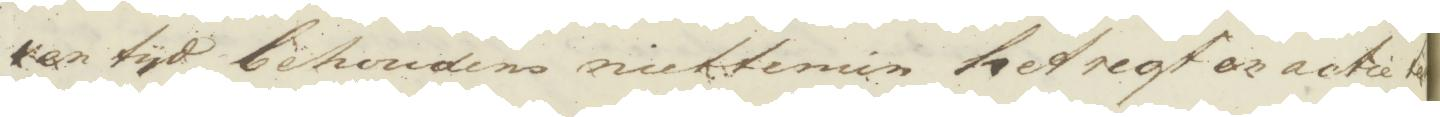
ven tijd, behoudens niettemin het regt en actie te
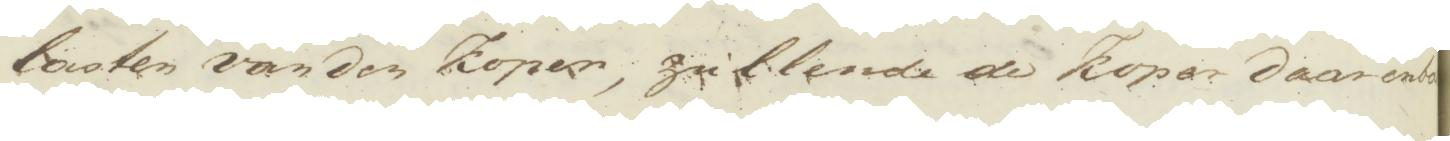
lasten van den Koper, zullende de koper daarenbo
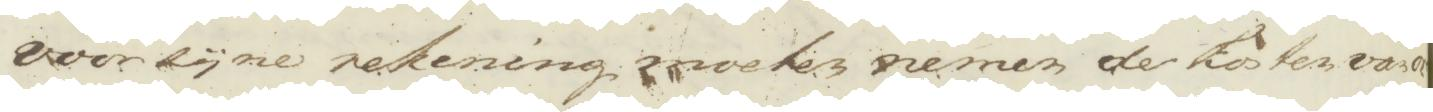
voor zijne rekening moeten nemen de kosten van o
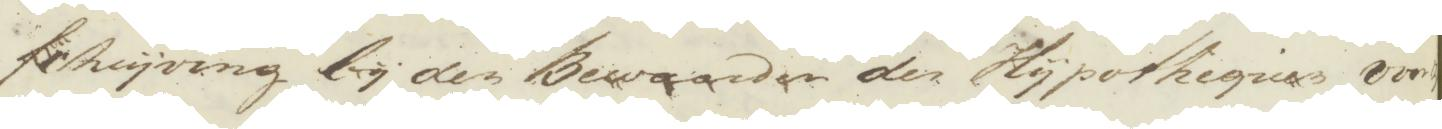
schrijving bij den Bewaarder der Hijpothequen, voor
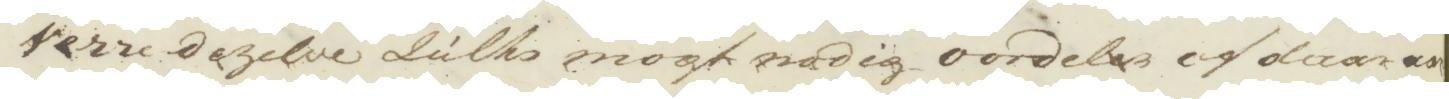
verre dezelve zulks mogt nodig oordelen of daar on
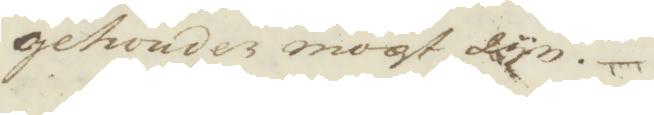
gehouden mogt zijn.
